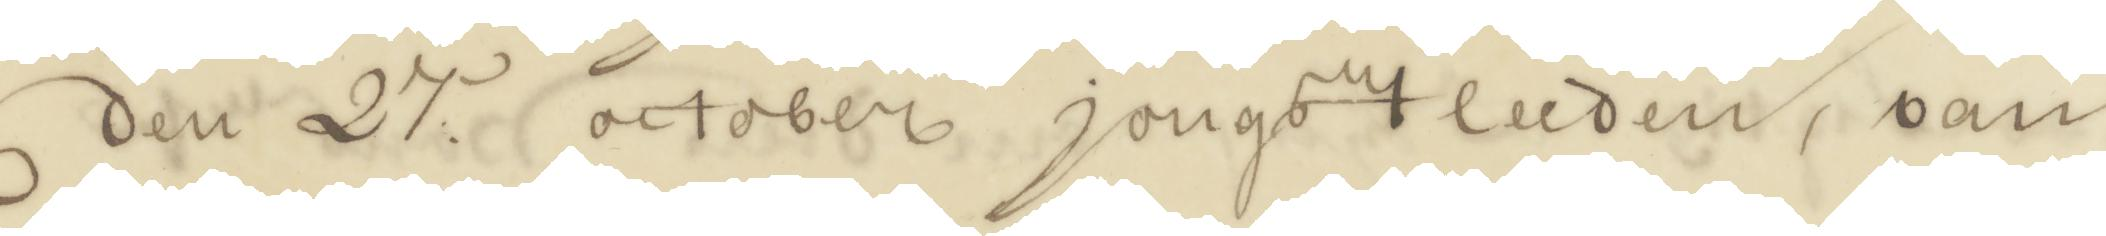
den 27:' october jongst leeden, van
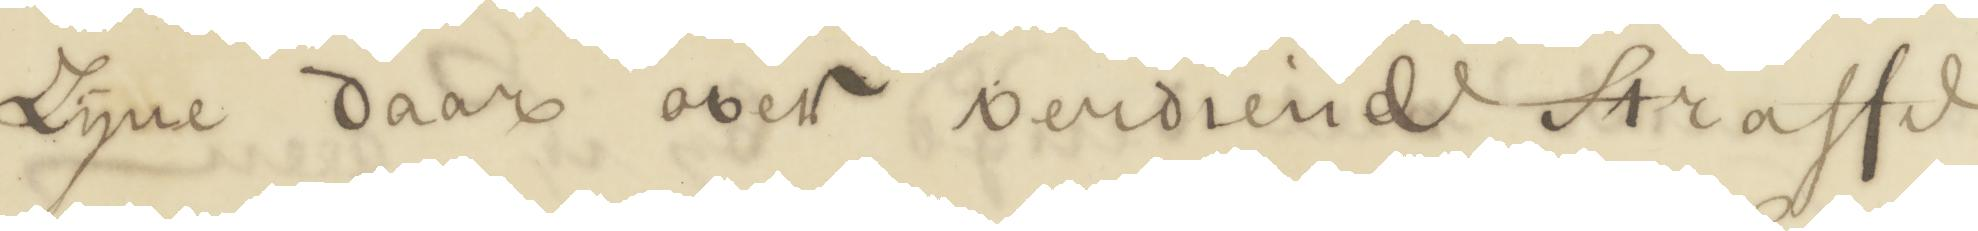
zijne daar over verdiende straffe
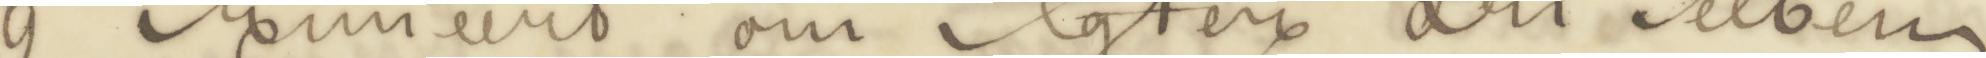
g' Eximeerd om Egter den selven
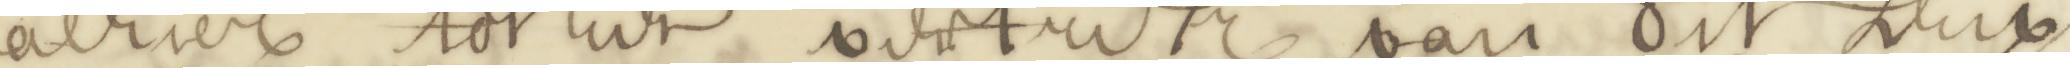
alhier tot het vertrek van dit schip
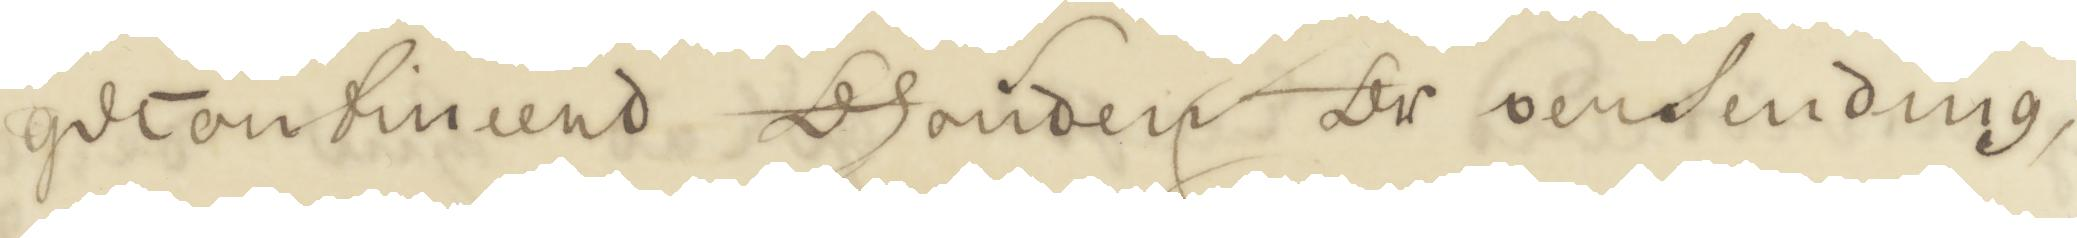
geconfineerd tehouden ter versending,
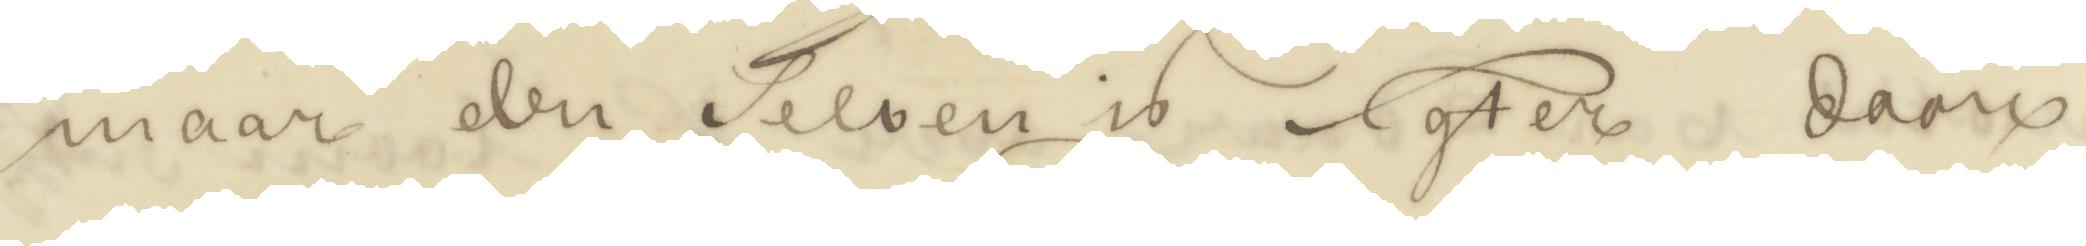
maar den selven is Egter door
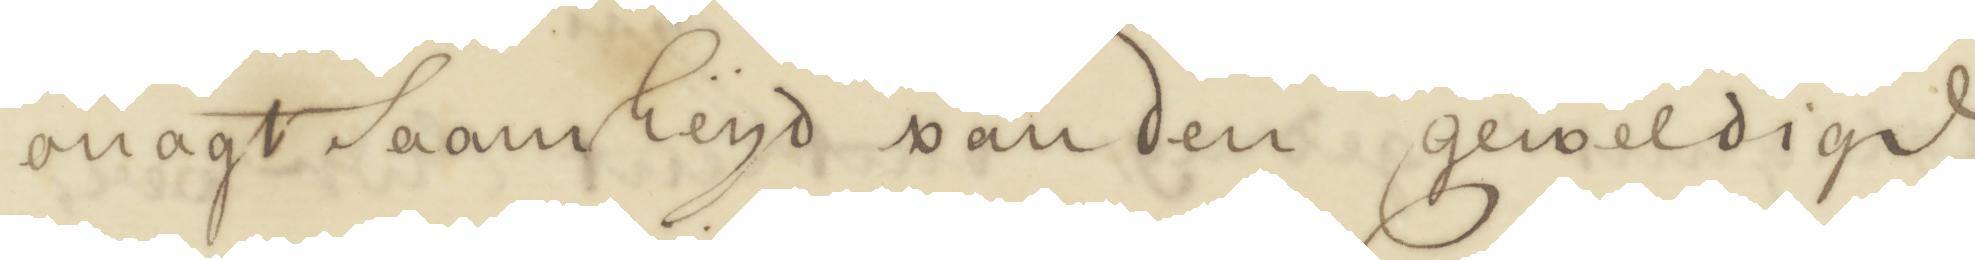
on agtsaamheijd van den geweldige
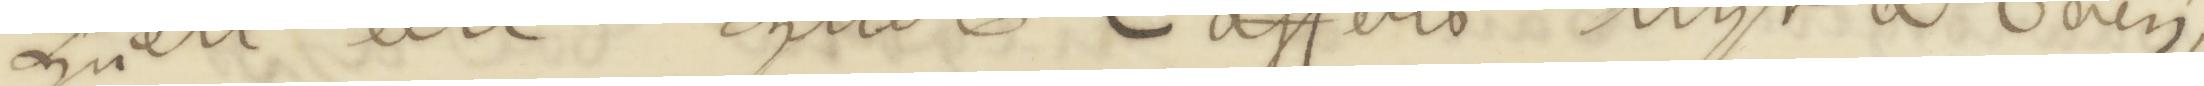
sijn en een syner caffers uijt de baeij„
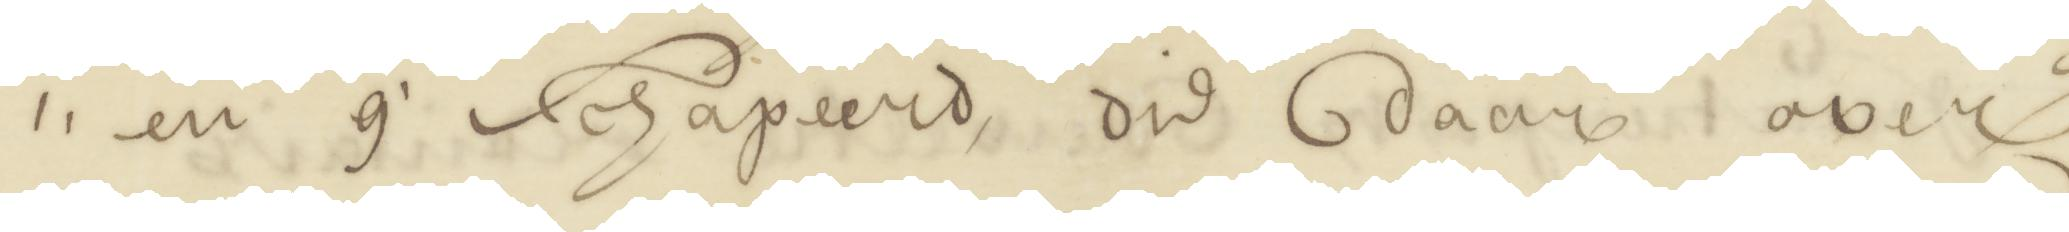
„en g’ Echapeerd, die daar over
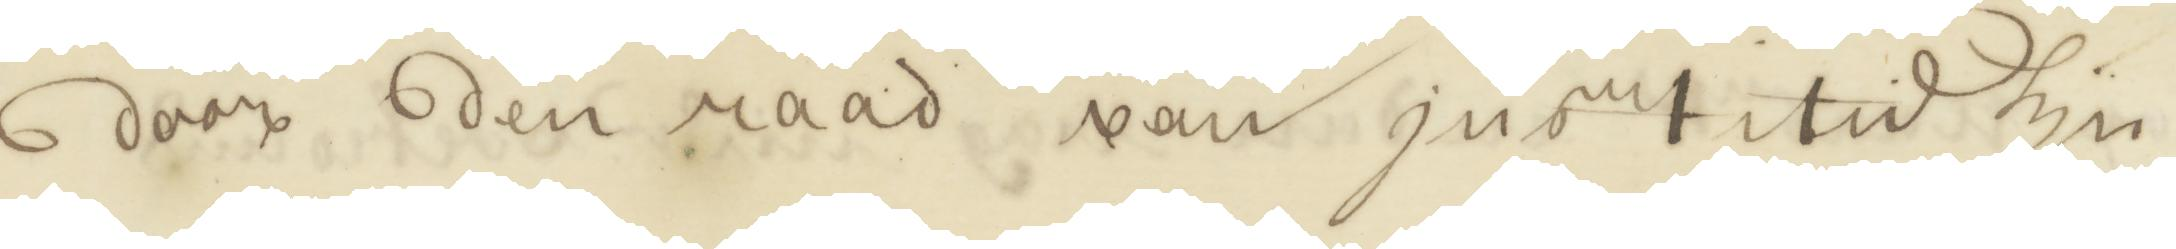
door den raad van justitie sijn
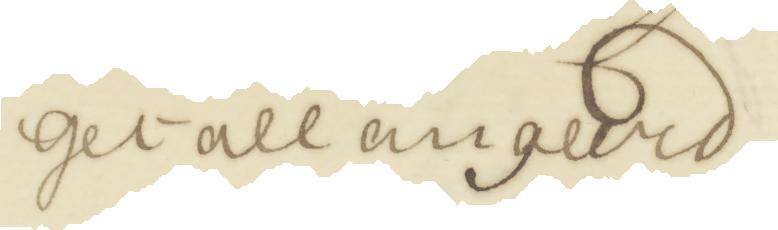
gecallangeerd.
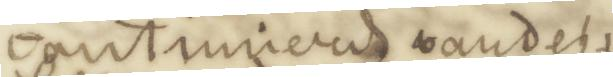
continueren van den„
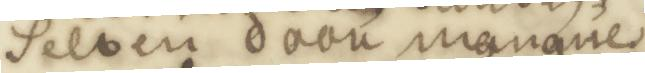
selven door manque
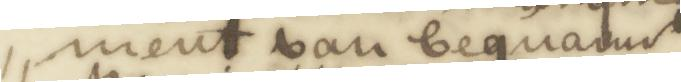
„ment van bequaame
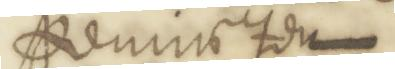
Pennisten
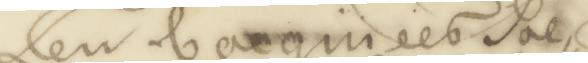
Een boeginees sol„
